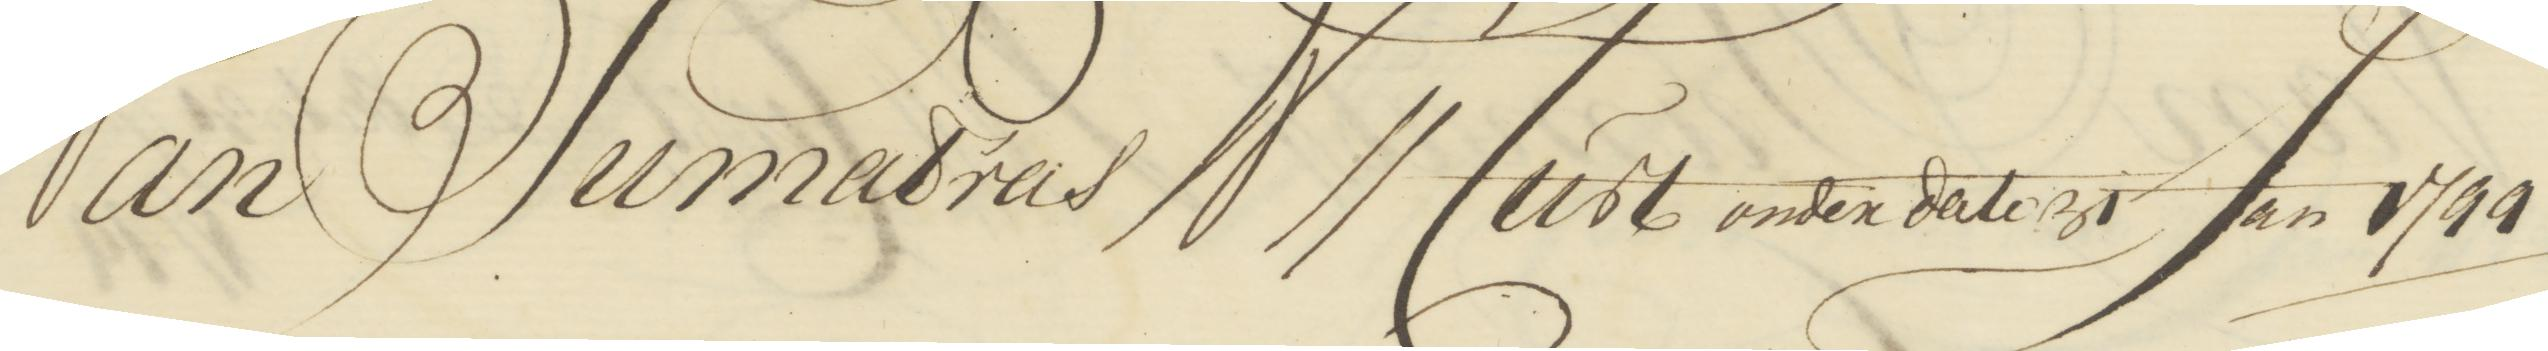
Van Sumatras W„t Cust onder dato 31 Jan 1744
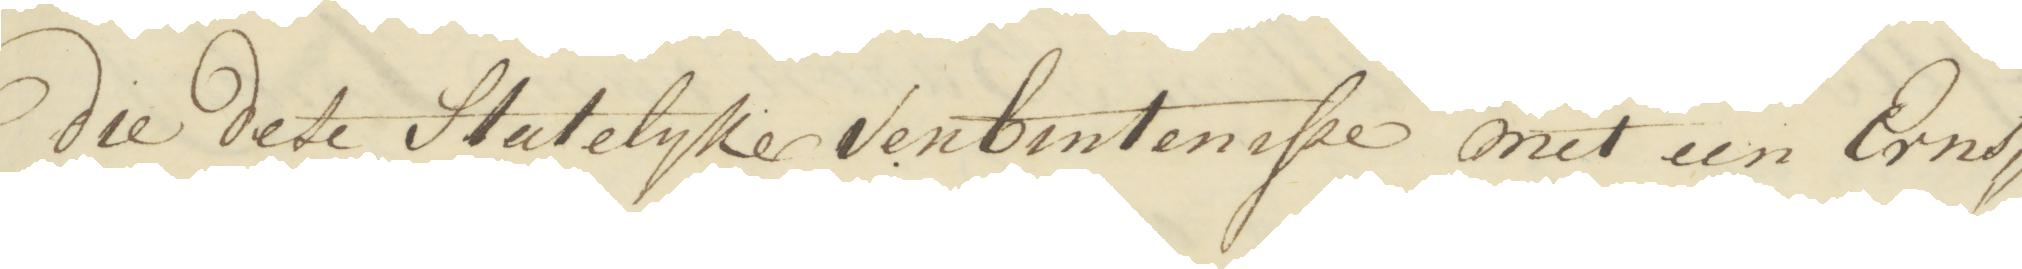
die dese statelyke verbintenisse met een Erns
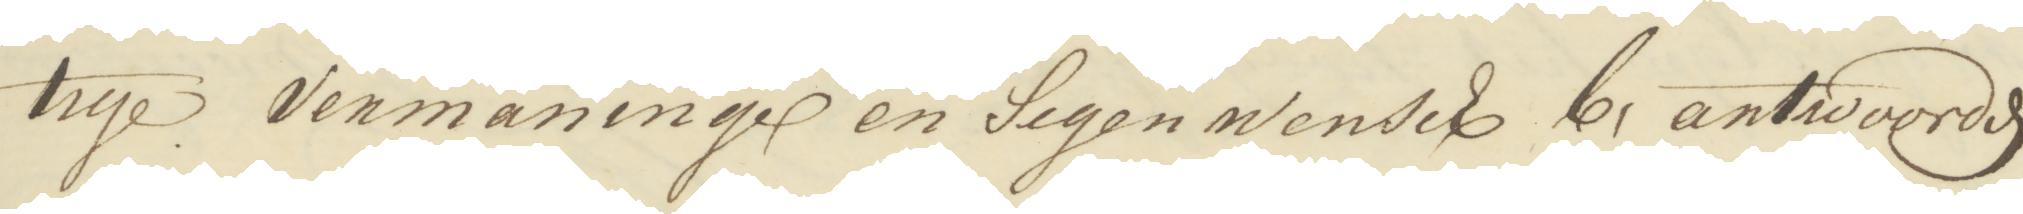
tige vermaninge en segenwensch b' antwoorden
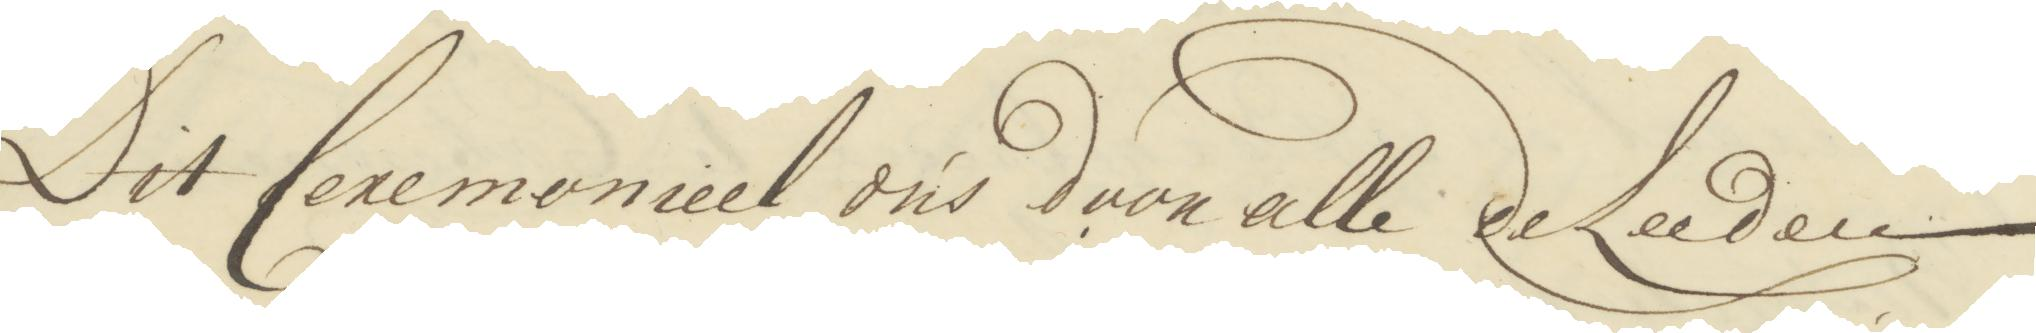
Dit Ceremonieel dus door alle de Leeden
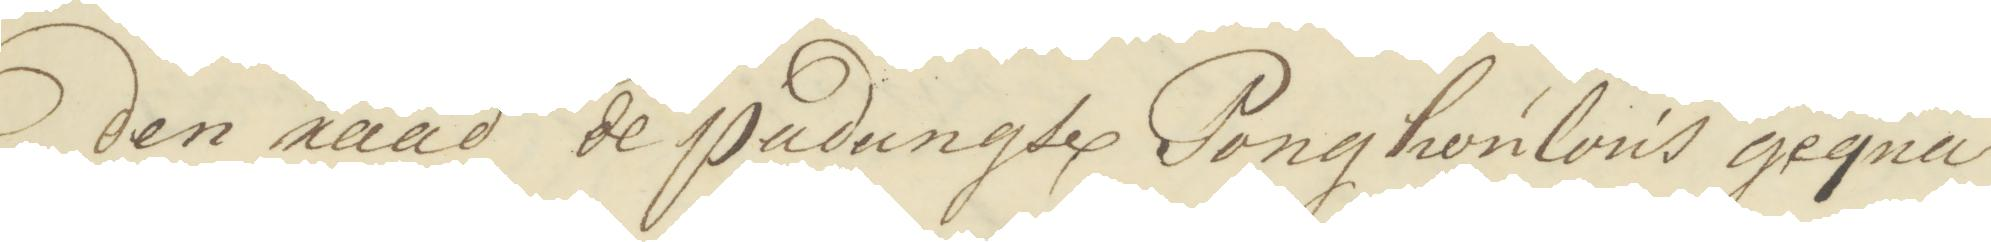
den raad de padangse Ponghoulous gequa
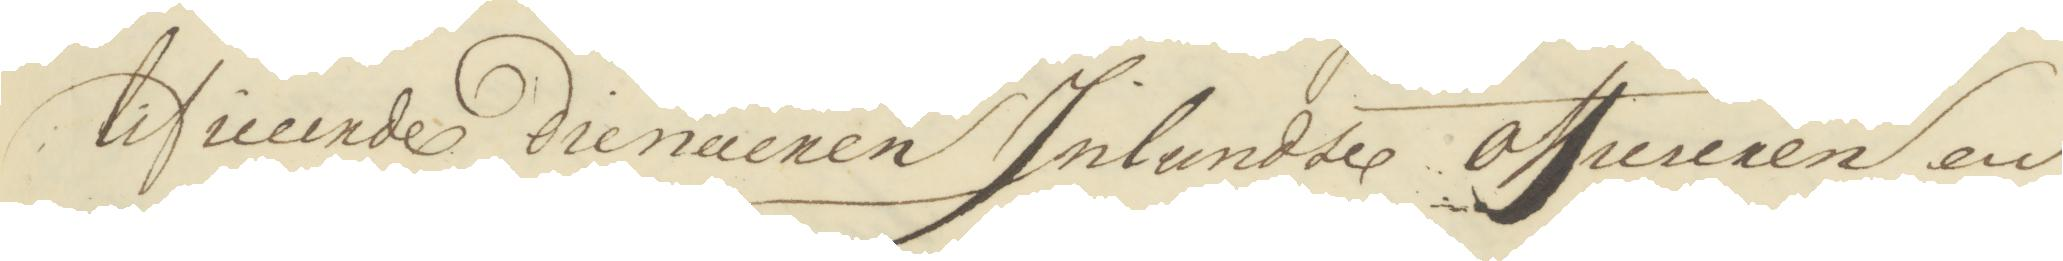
lificeerde dienaeren Jnlandse officieren en
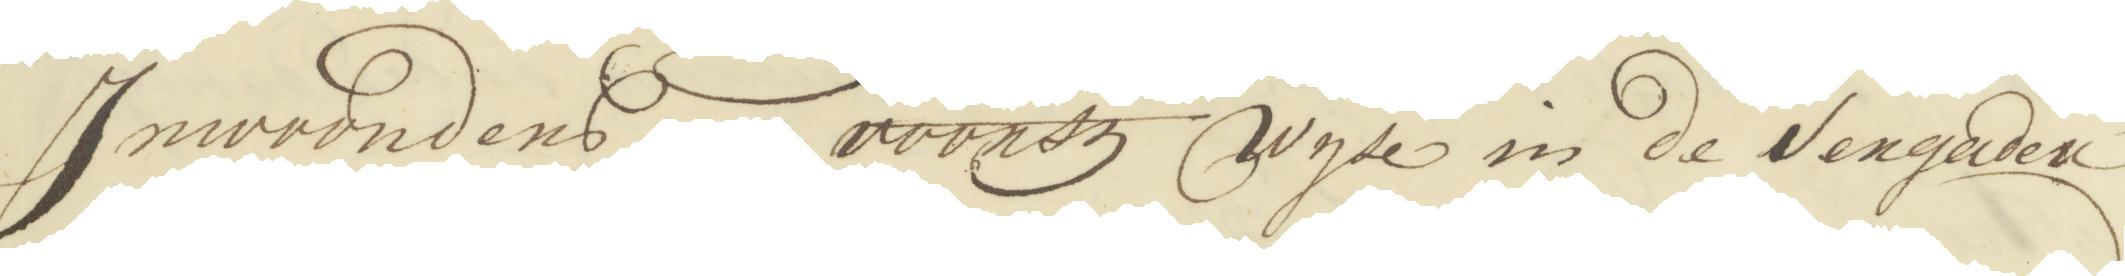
Jnwoonders op voorsz wyse in de vergader
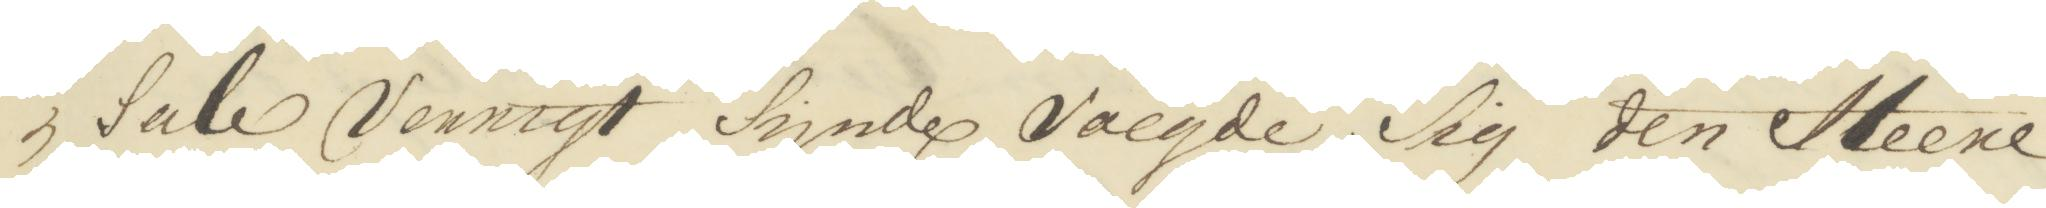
„sale verrigt sijnde voegde sig den Heere
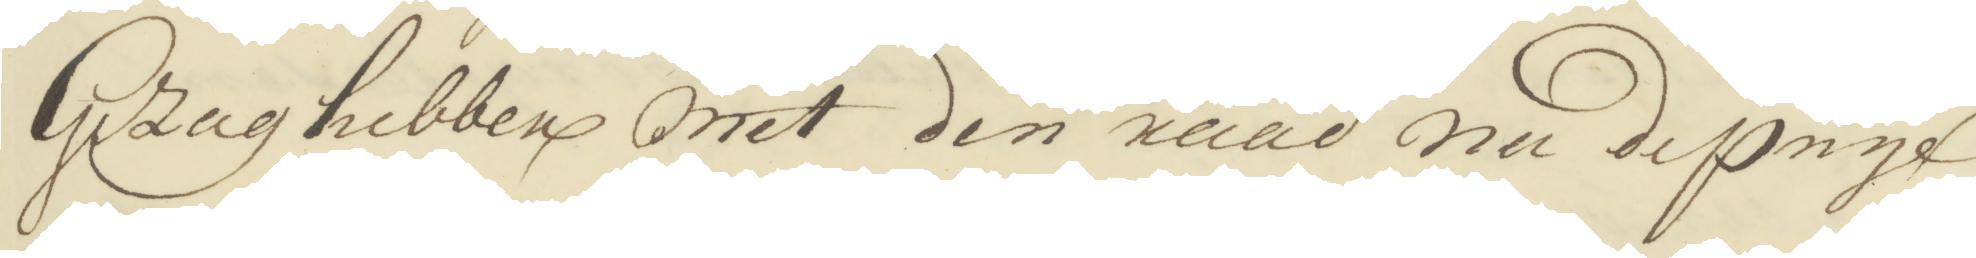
Gezaghebber met den raad na de puije
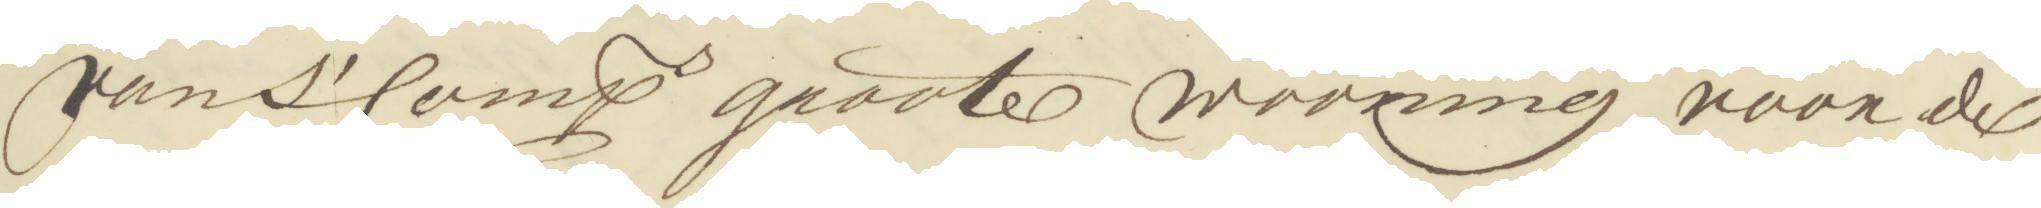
van s' Comps groote wooning voor de
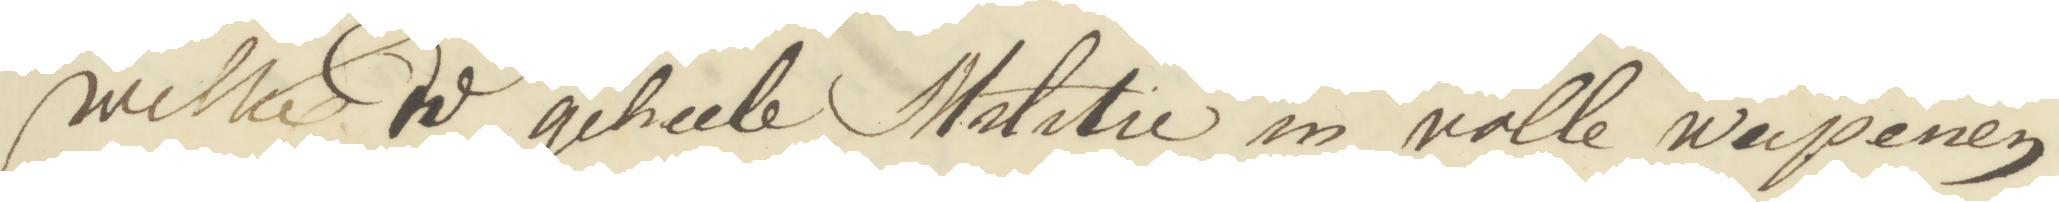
welke de geheele Militie in volle wapenen
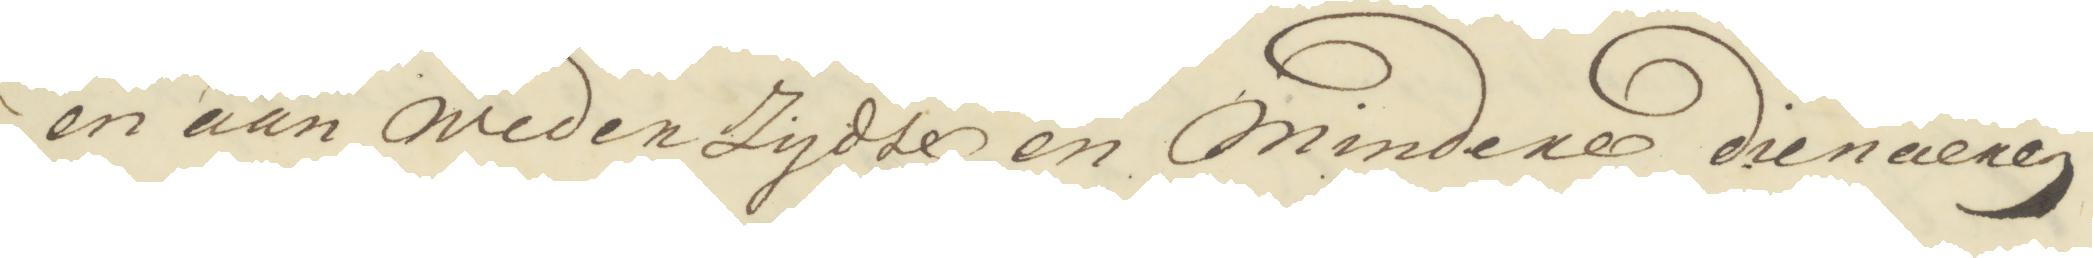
en aan wederzijdse en mindere dienaeren
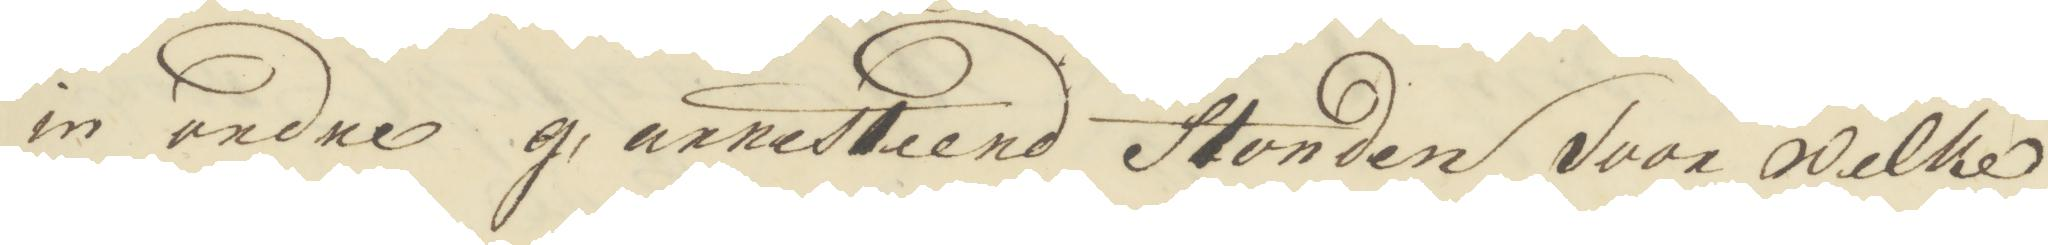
in ordre g'arresteerd stonden voor welke
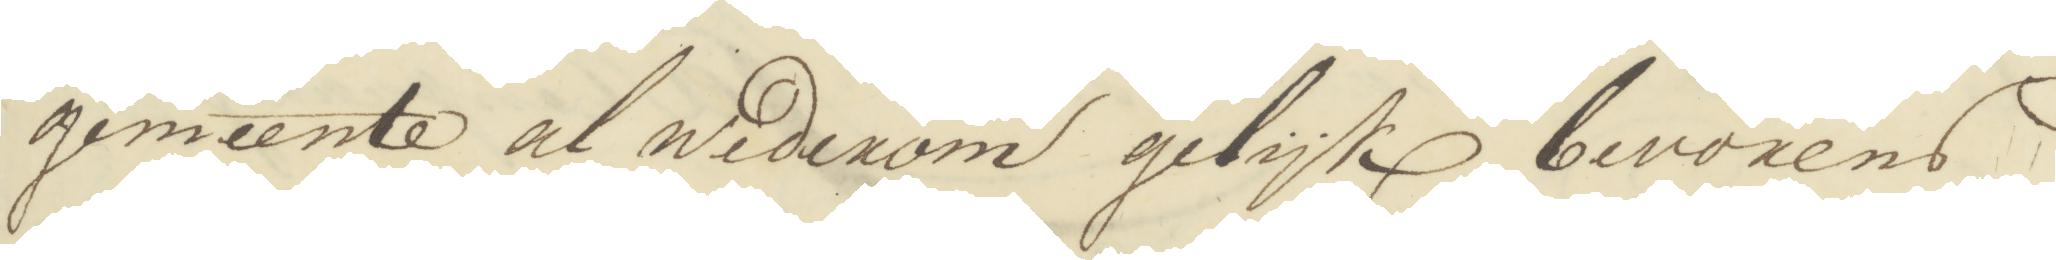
gemeente al wederom gelijk bevorens
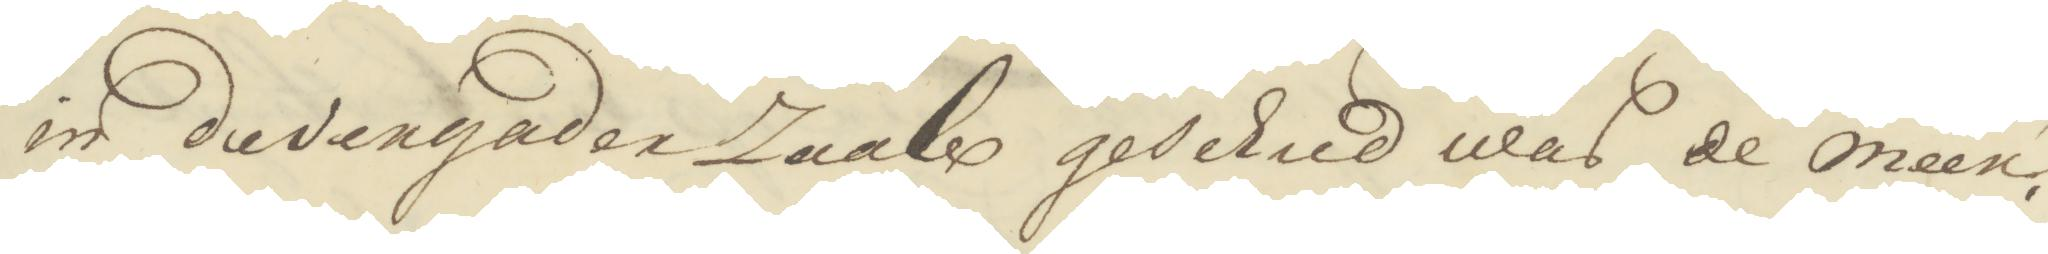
in die vergaderzaale geschied was de meer,
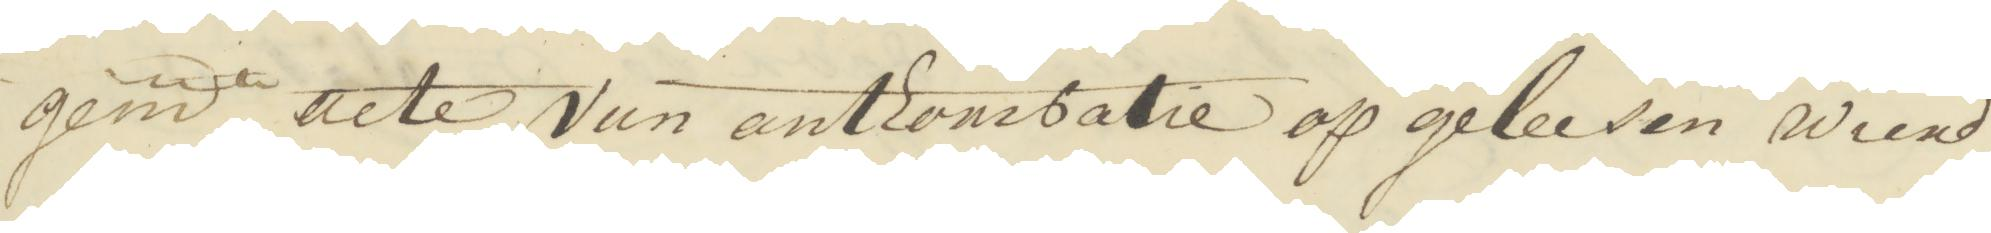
gem acte van authorisatie op geleesen wierd
